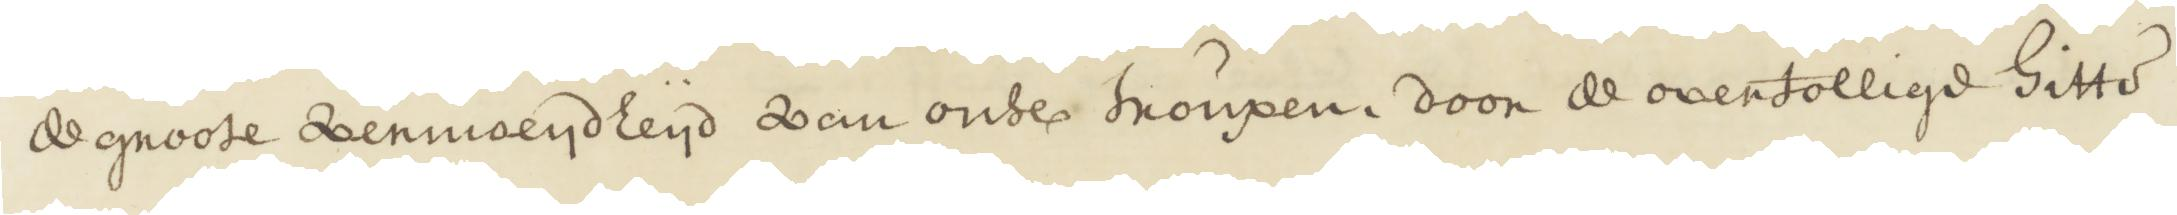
de groote vermoeijdheijd van onse troupen, door de overtollige hitte
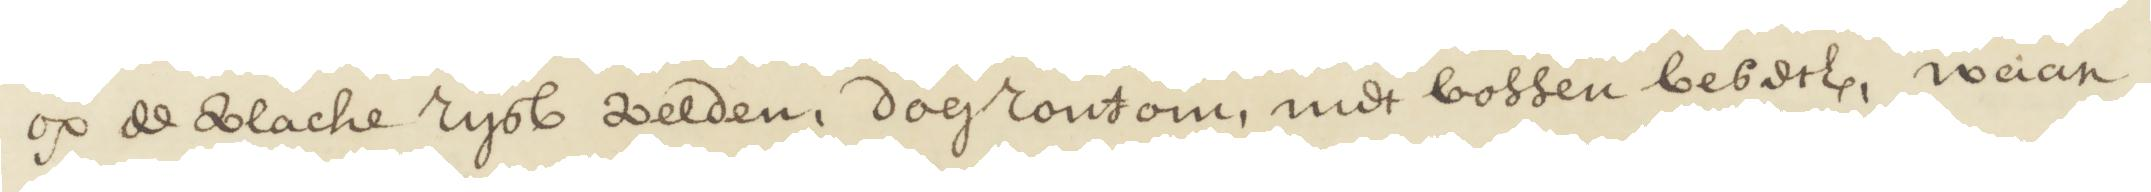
op de vlacke rijst velden, dog rontom, met bossen beseth, waar
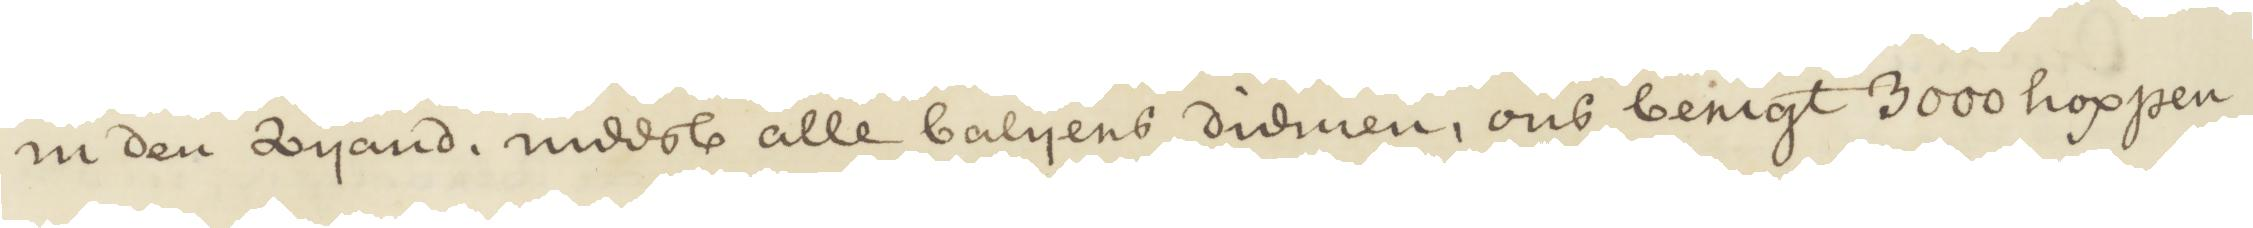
in den vijand, meest alle balijers die men, ons berigt 3000 koppen
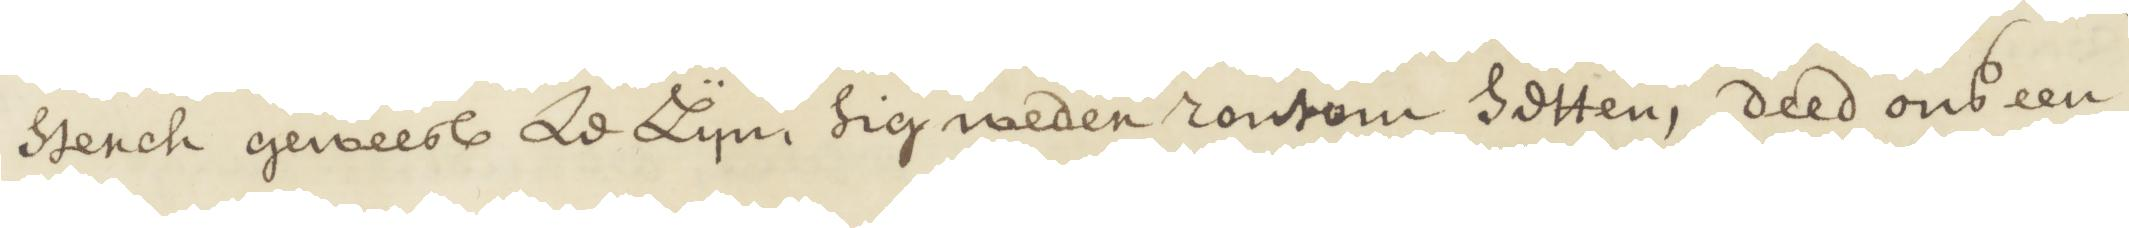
sterck geweest te Zijn, sig weder rontom setten, deed ons een
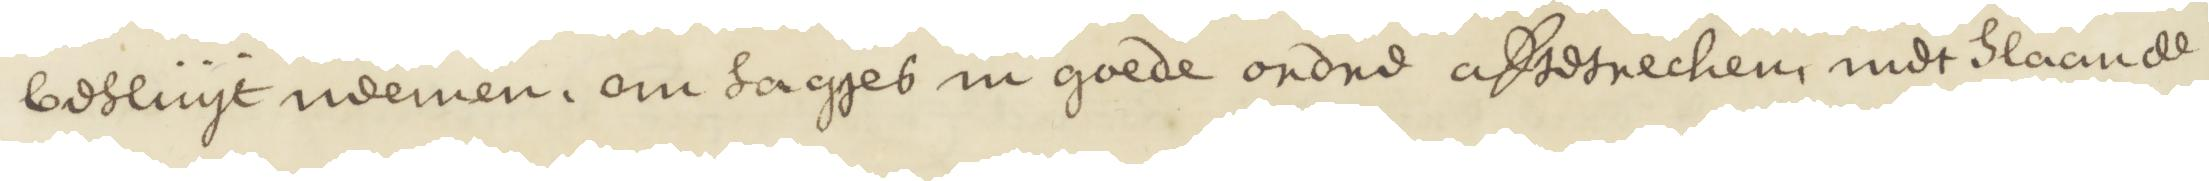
besluijt neemen, om sagjes in goede ordre aftetrecken, met slaande
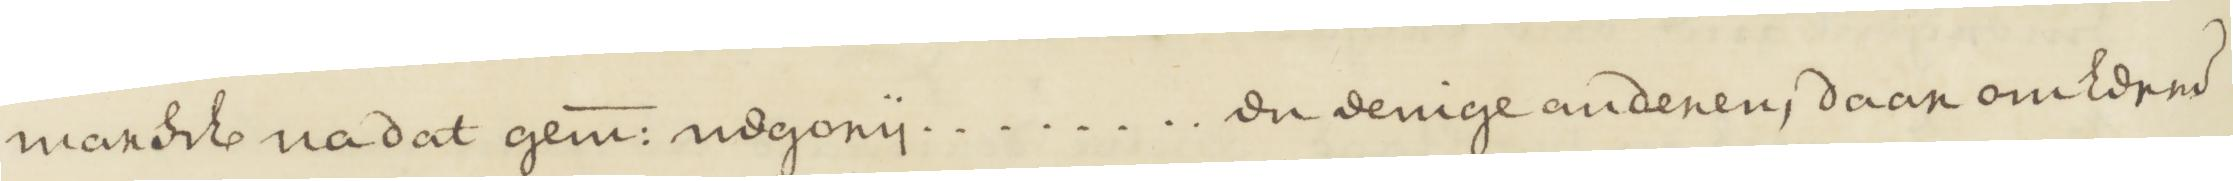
marsch nadat gem: negorij . . . . . . . . en eenige anderen, daar om herne
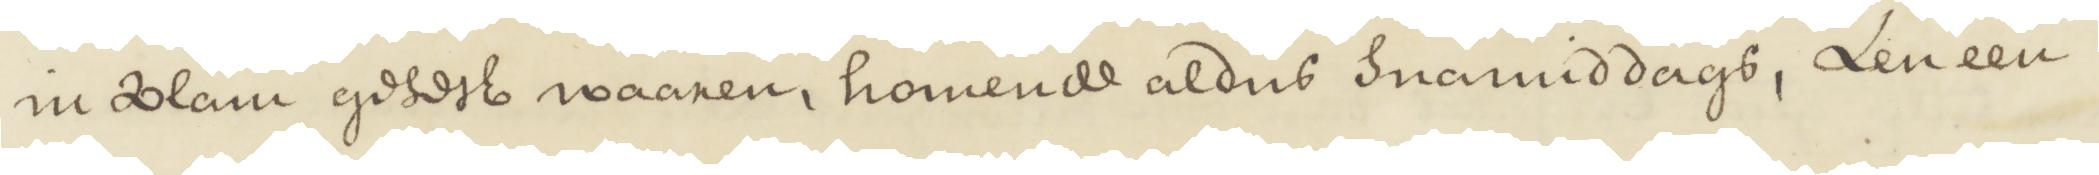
in vlam geseth waaren, komende aldus snamiddags, ten een
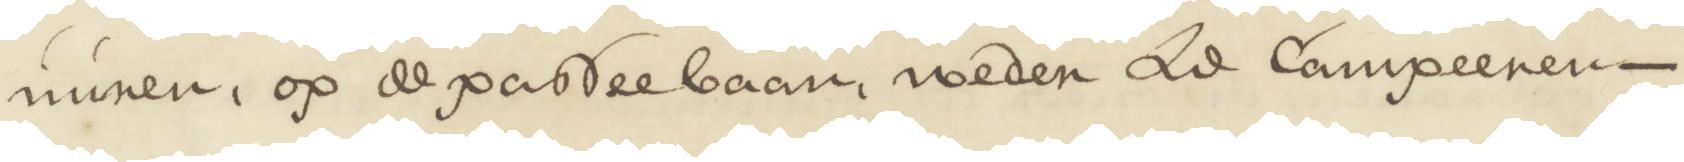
uuren, op de passeebaan, weder te Campeeren -
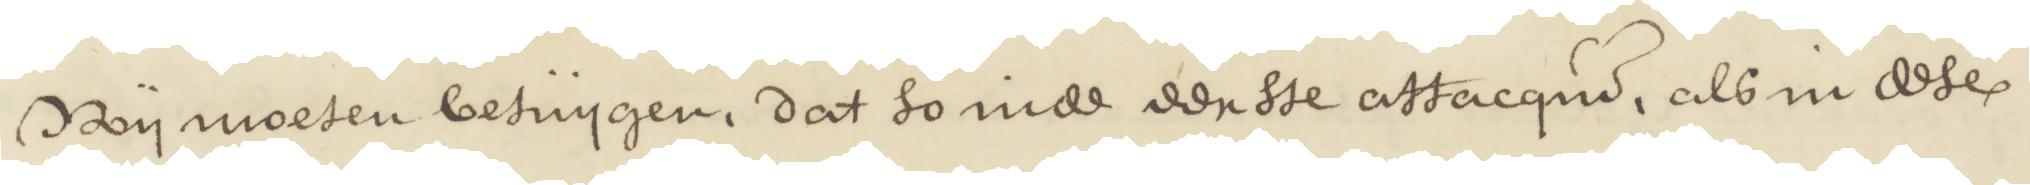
Wij moeten betuijgen, dat so inde eerste attacque, als in dese
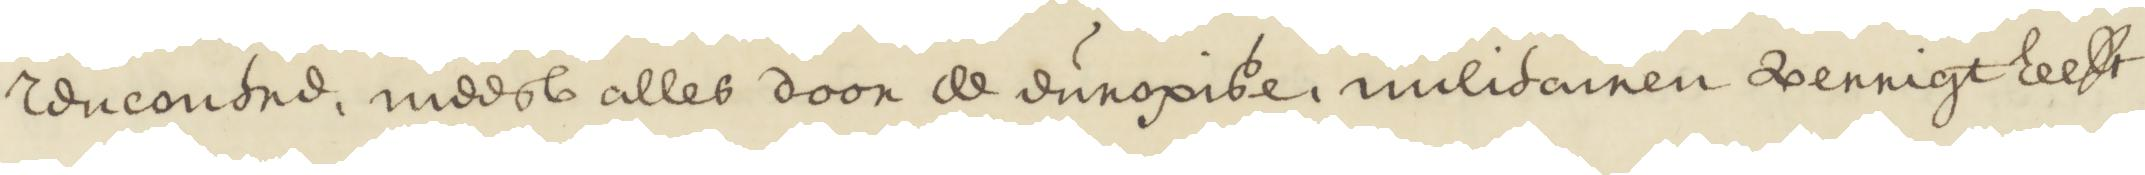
rencontre, meest alles door de europise militairen verrigt heeft
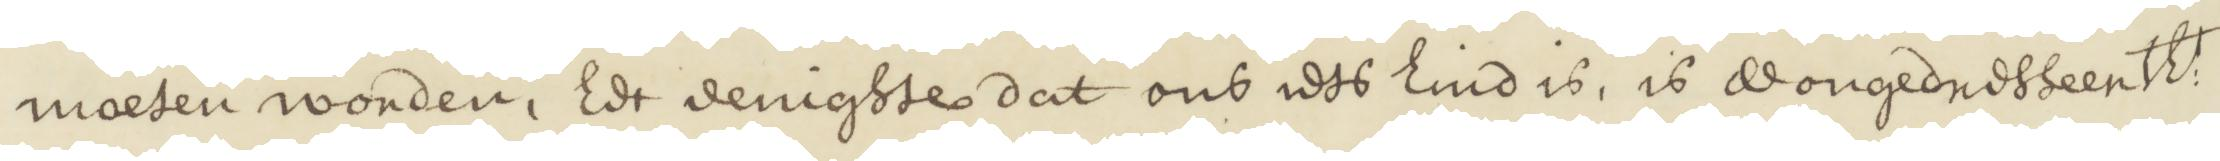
moeten worden, het eenigste dat ons iets hind is, is de ongedresseerth:t
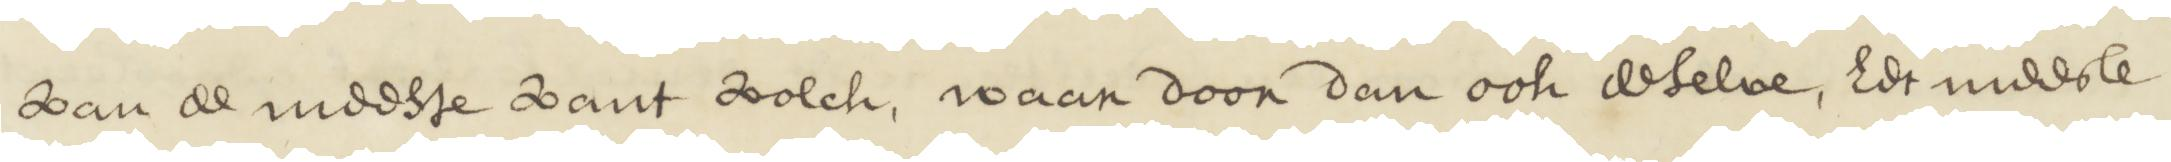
van de meeste vant volck, waar door dan ook deselve, het meeste
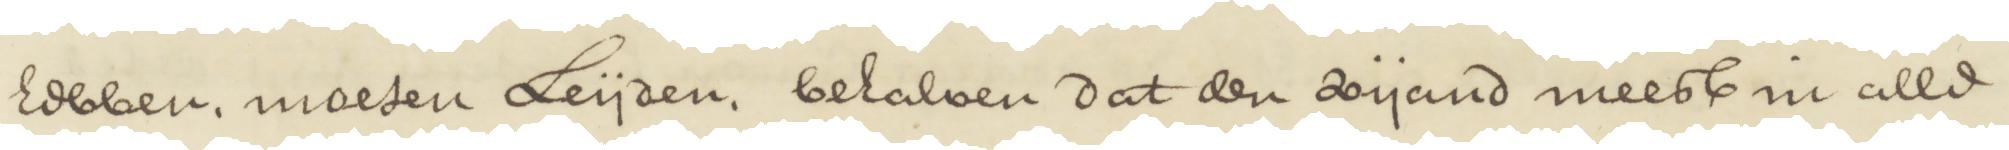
hebben, moeten Leijden, behalven dat den vijand meest in alle
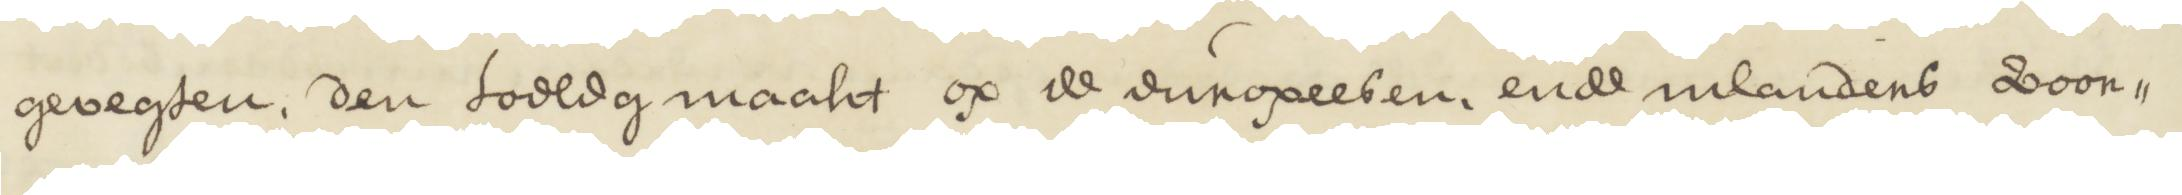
gevegten, den toeleg maakt op de europeesen, ende inlanders voor„
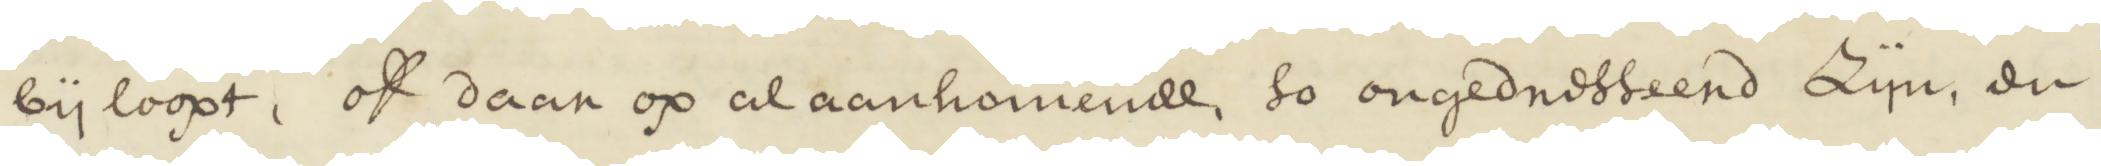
bij loopt, of daar op al aankomende, so ongedresseerd Zijn, en
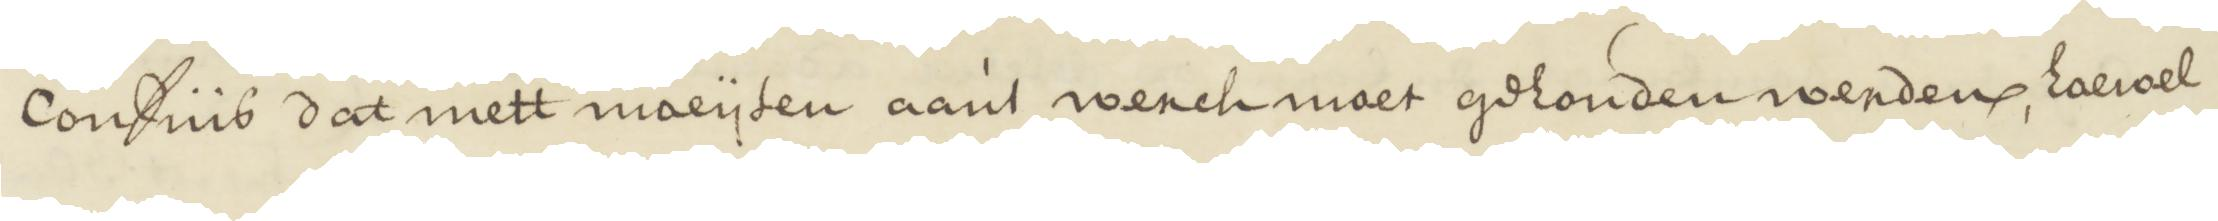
confuis dat mett moeijten aan't werck moet gehouden werden, hoewel
